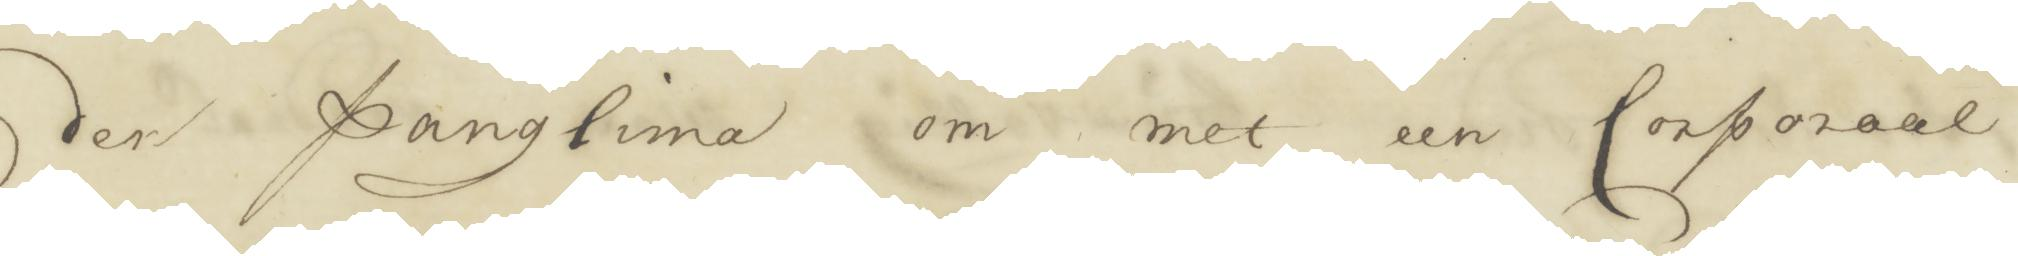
der panglima om met een Corporaal
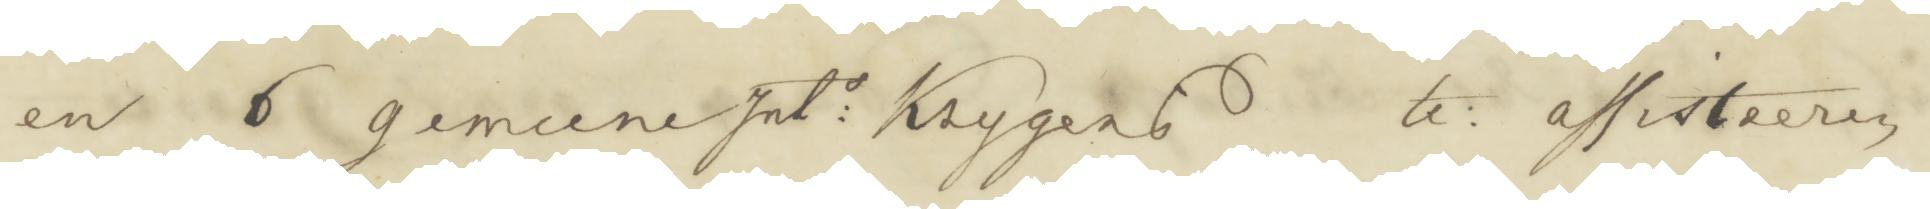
en 6 gemeene Jnl:s krygers te assisteeren,
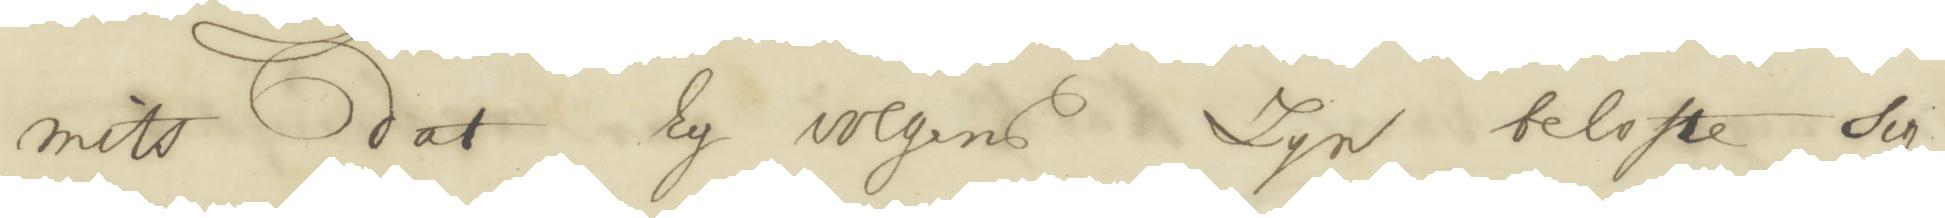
mits dat hy volgens zyn belofte sy
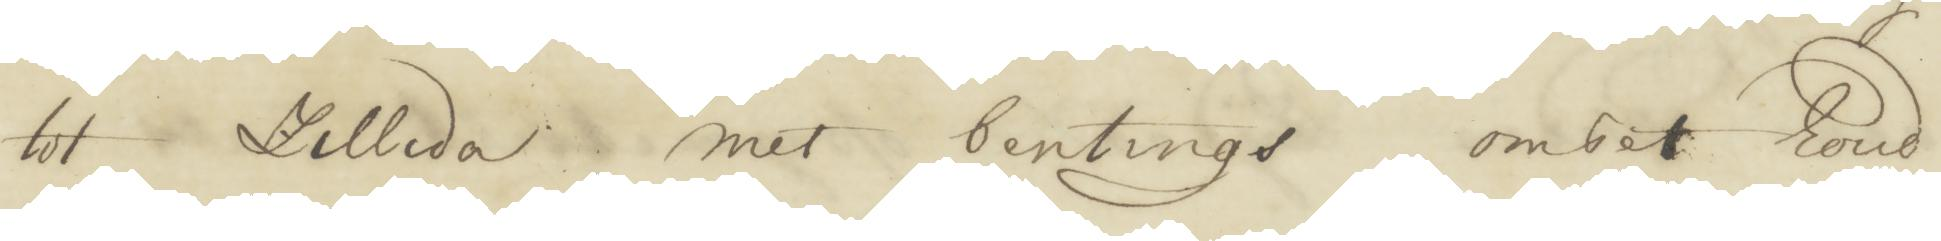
tot Zilleda met bentings omset houd
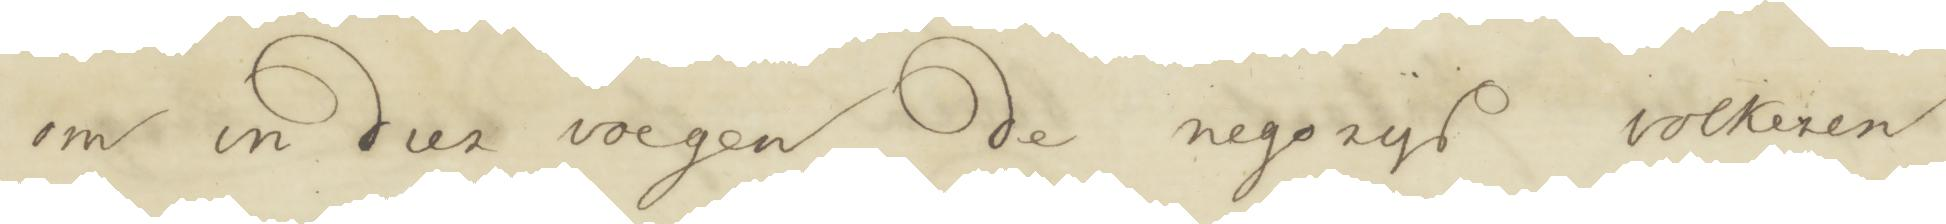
om in dier voegen de negorijs volkeren
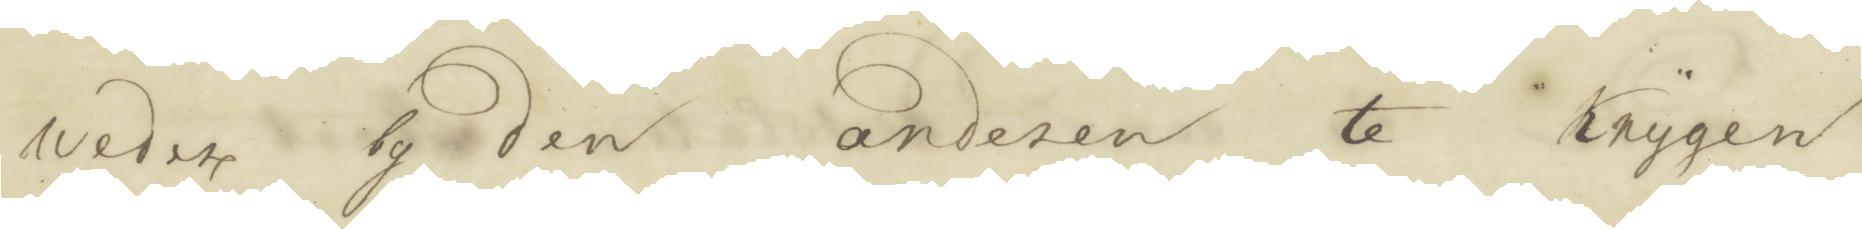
weder by den anderen te krijgen
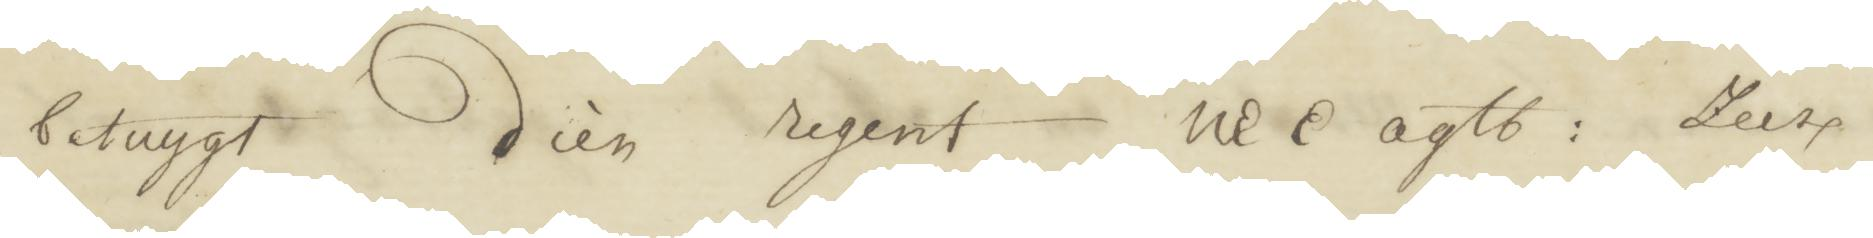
betuygt dien regent UE E agtb: zeer
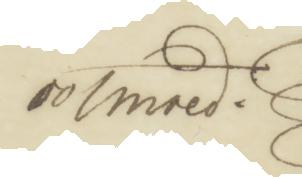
ootmoed.
